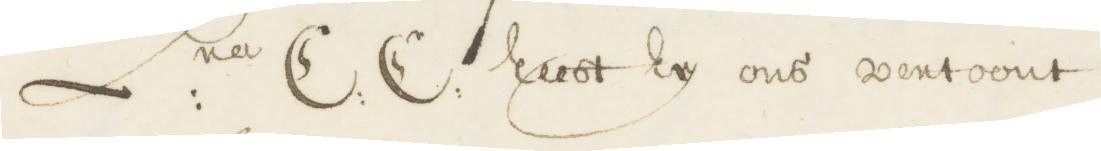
L:ra C: C: heest hy ons vertoont
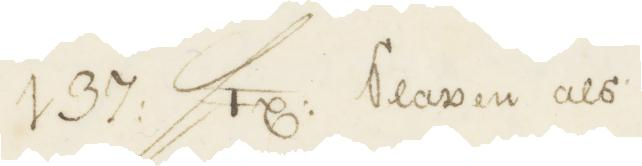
137: stx: slaven als
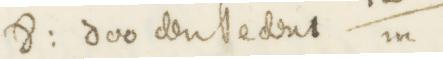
8: doo den sedert 12/m
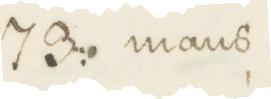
73: mans
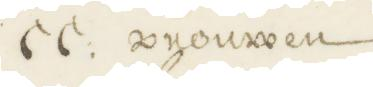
55: vrouwen
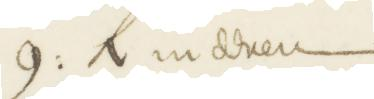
9: kinderen
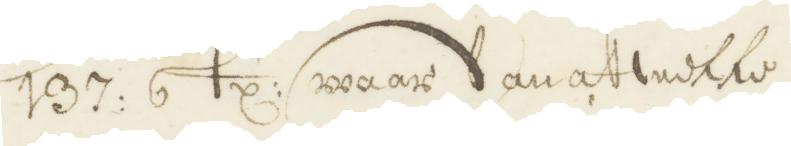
137: stx: waar van aftrekke
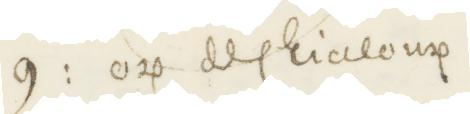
9: op de Chialoup
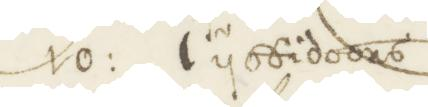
10: tijssidoors
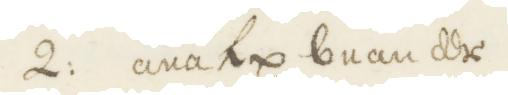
2: arakx brander
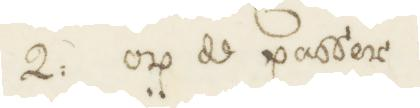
2: op de passer
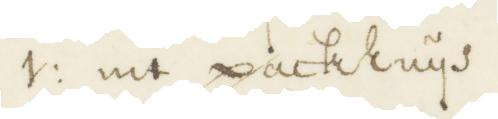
1: in't packhuijs
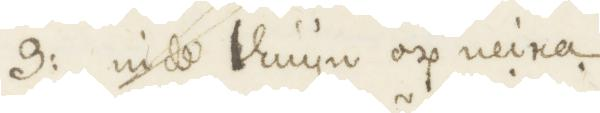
3: inde thuijn op neira
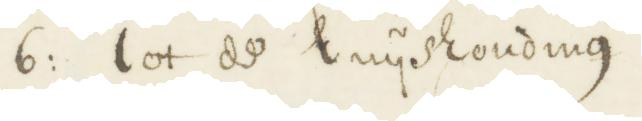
6: tot de huijshouding
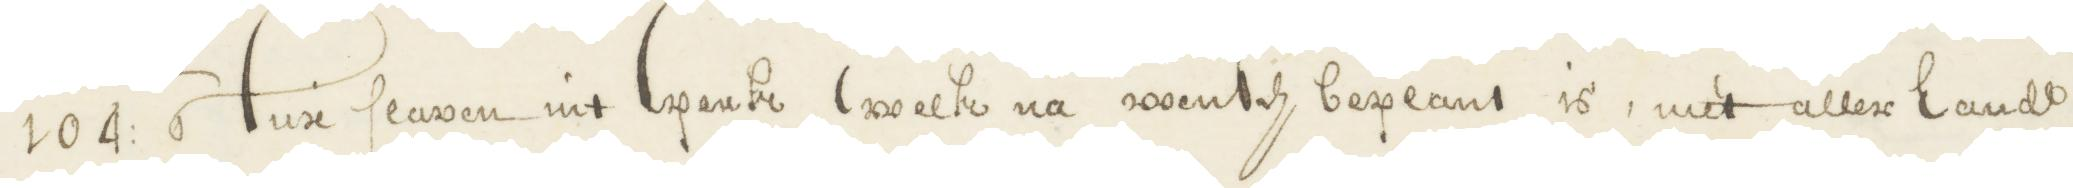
104: stux slaven in't tperk t welk na wensen beplant is, met aller hande
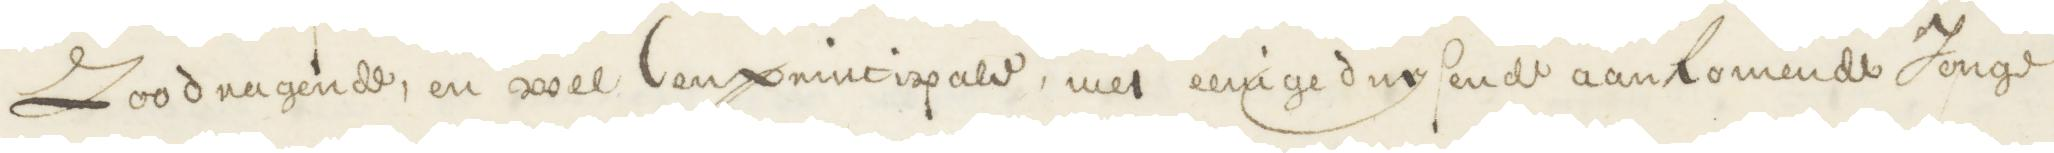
zoodragende, en wel ten principale, met eenige duysende aankomende Ionge
